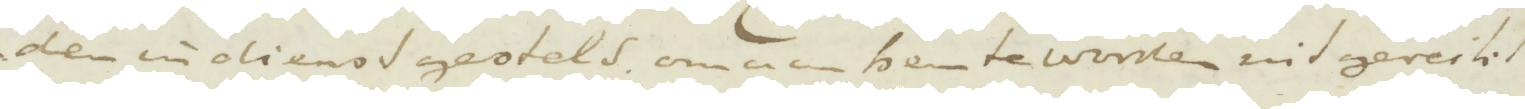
=den in dienst gesteld om aan hem te worden uitgereikt
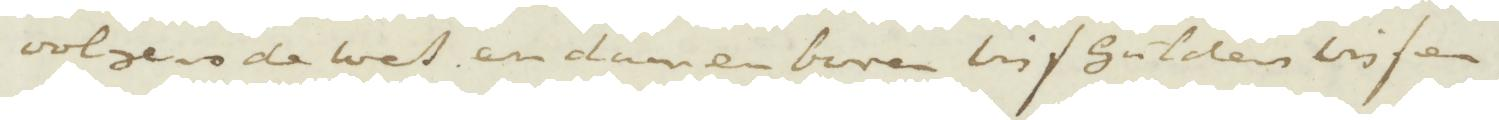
volgens de wet en daar en boven vijf Guldens vijf en
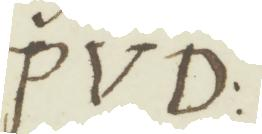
PVD:
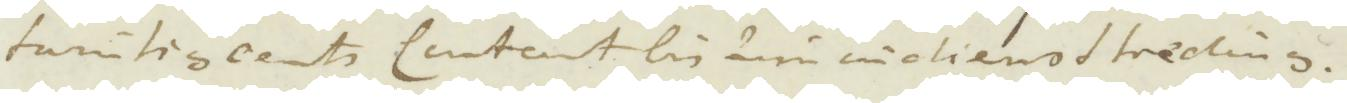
twintig cents contant bij zijn in dienst treding.
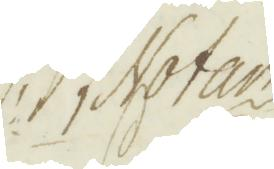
S:V:L: Notaris
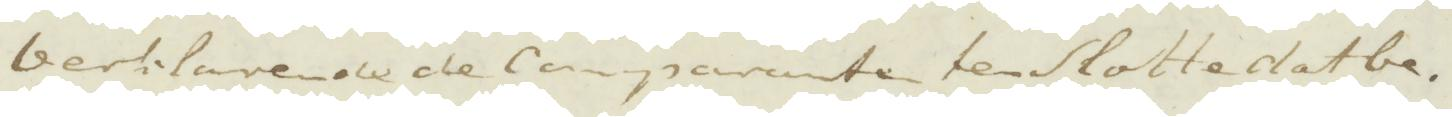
verklarende de comparante ten slotte dat be.
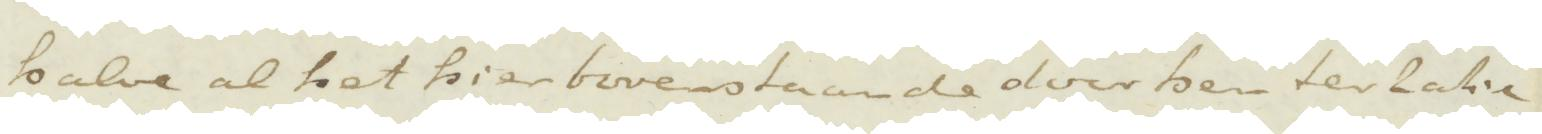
halve al hat hier bovenstaande door hen ter zake
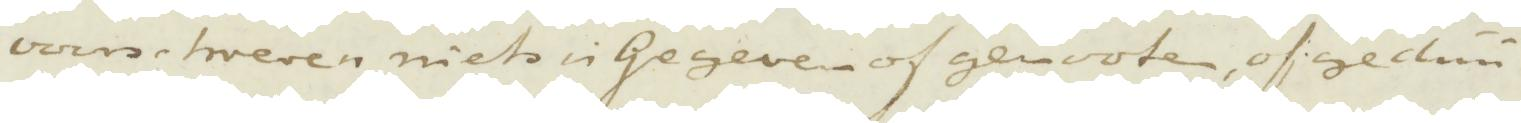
voorschreven niets is Gegeven of genooten, of geduur
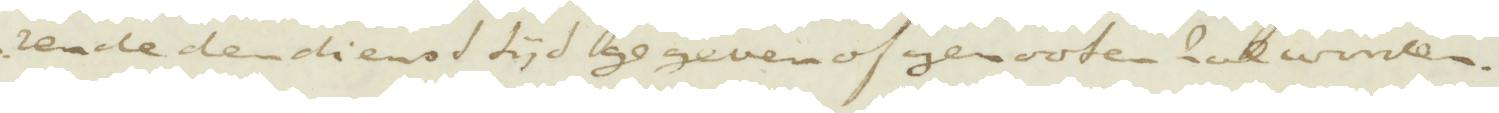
„rende de dienst tijd gegeven of genooten zal worden.
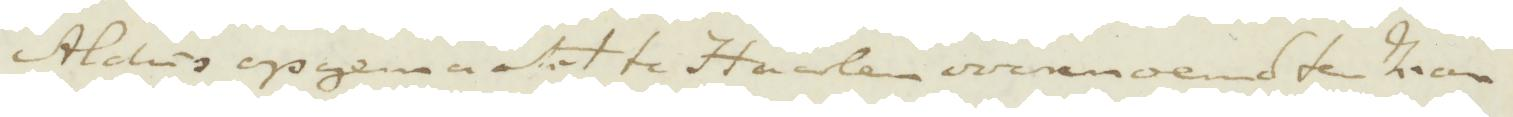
Aldus op gemaakt te Haarlem voornoemd te Kan
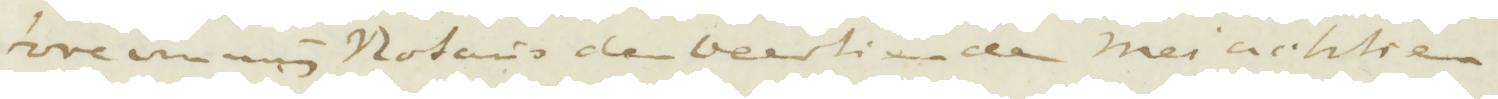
tore van mij Notaris de veertiende mei achtien
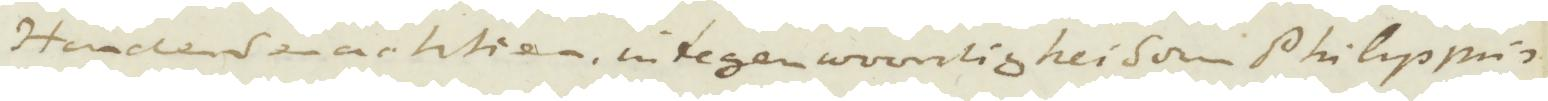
Honderd en achtien, in tegenwoordigheid van Philippus
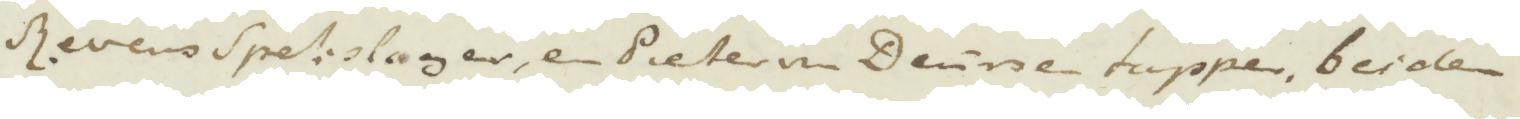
Revens Spekslager, en Pieter van Deure tapper, beiden
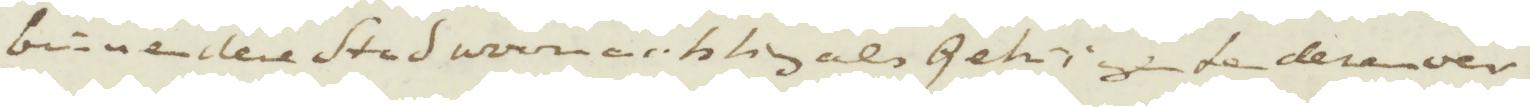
binne dese stad woonachtig als Getuige te dese ver
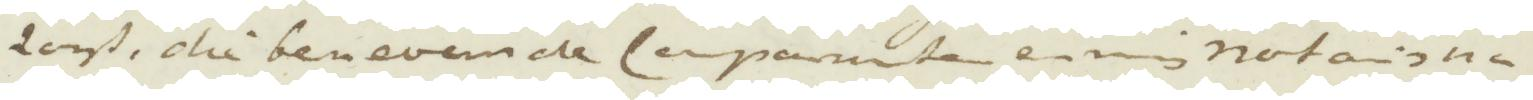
zent, die benevens de Comparanten en mij notaris na
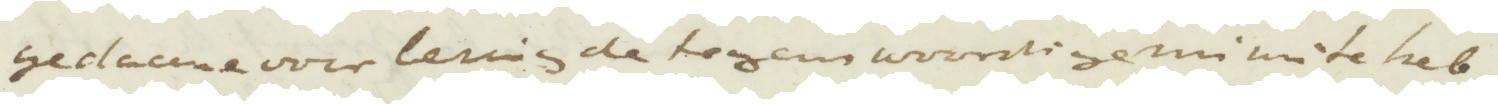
gedaane voorlezing de tegenswoordige minute te heb
